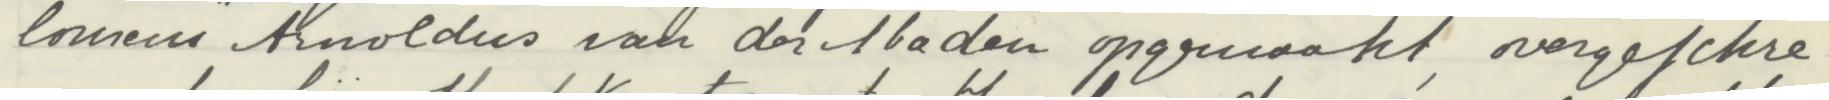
lomeus Arnoldus van der Maden opgemaakt overgeschre
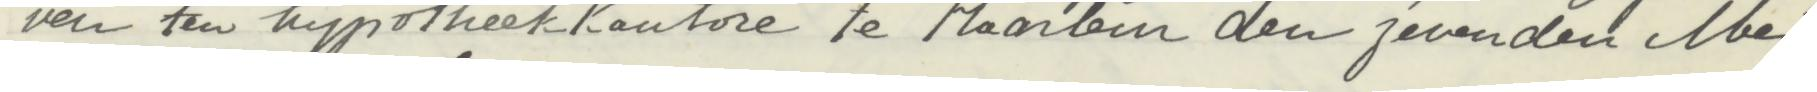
ven ten hijpotheekkantore te Haarlem den zevenden Mei
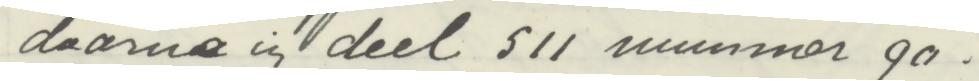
daarna in deel 511 nummer 90
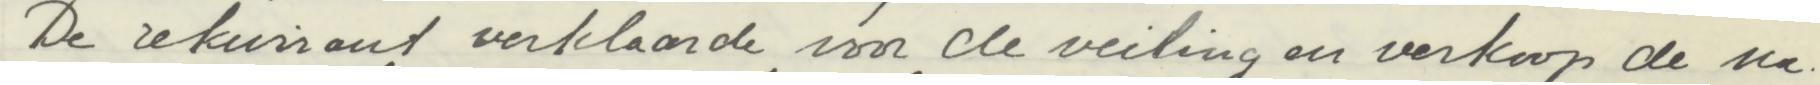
De rekwirant verklaarde voor de veiling en verkoop de na
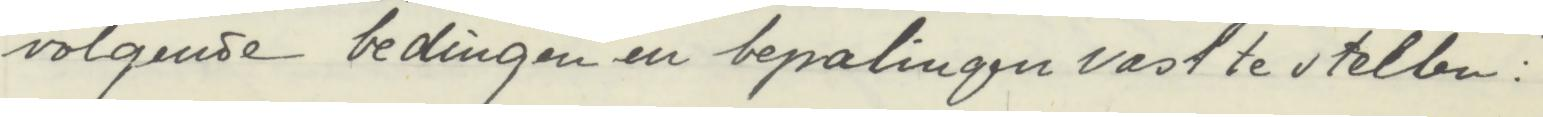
volgende bedingen en bepalingen vast te stellen:
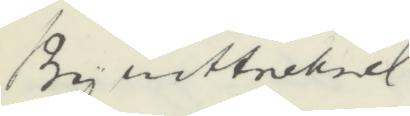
Bij uittreksel
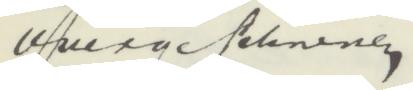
overgeschreven
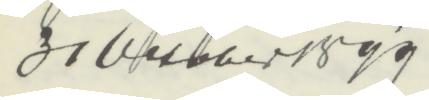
31 October 1899
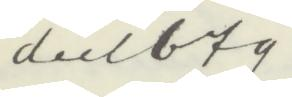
deel 679
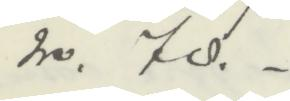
no. 78. —
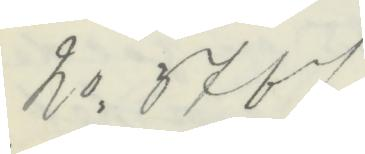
N=o 3767
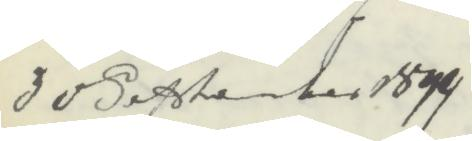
30 September 1899
